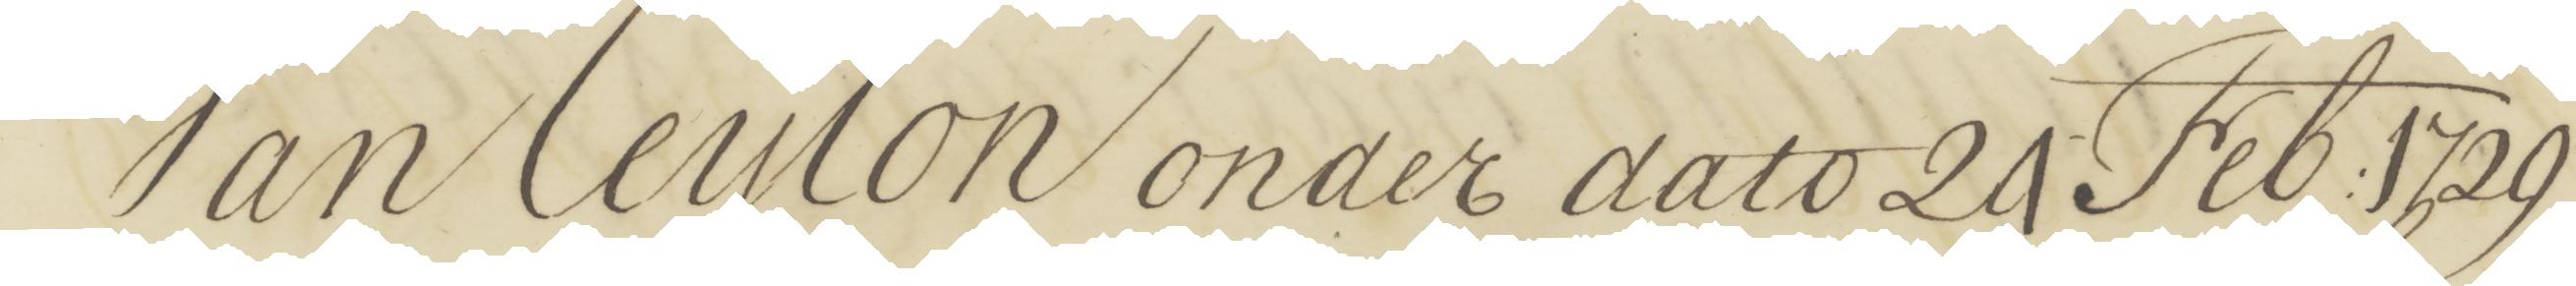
Van Ceijlon onder dato 24 Feb: 1729
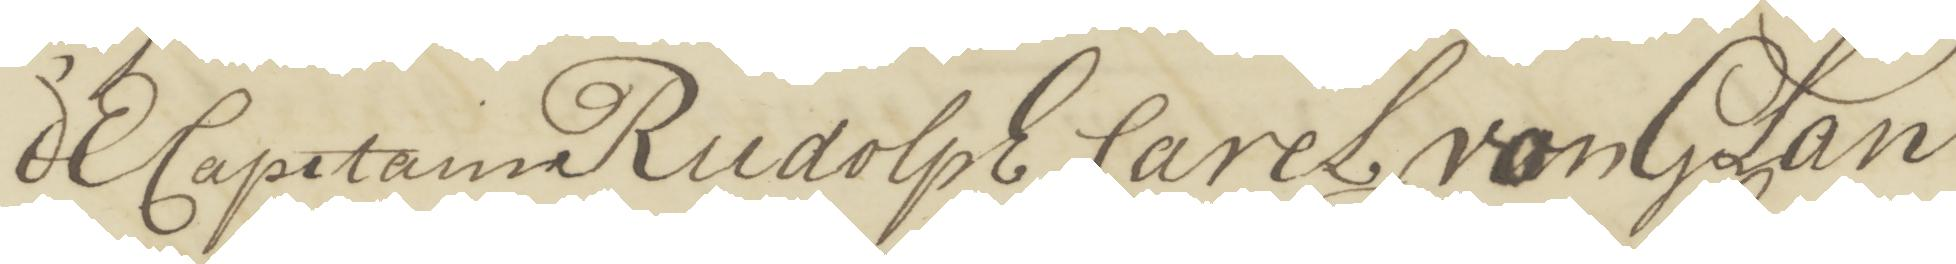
d'E Capitain Rudolph Carel van G Lan
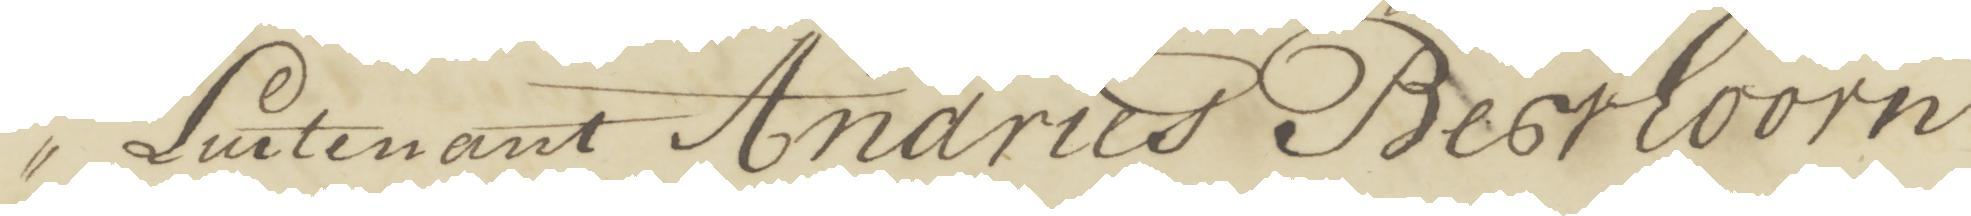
„ Luitenant Andries Besthoorn
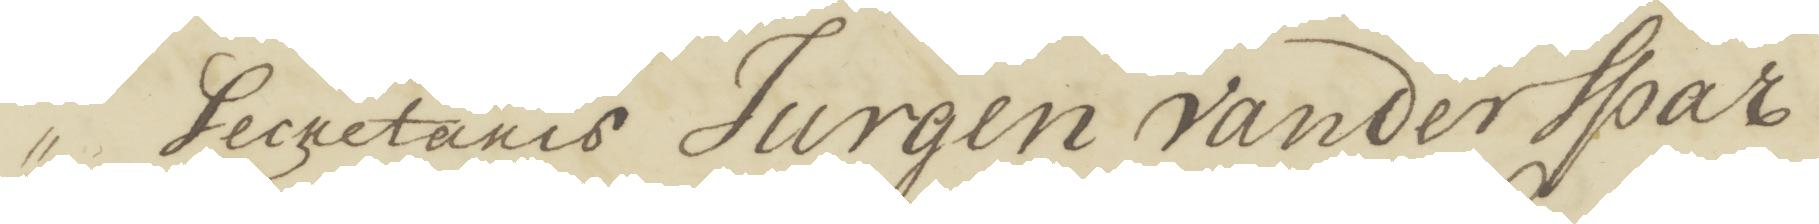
„ Secretaris Iurgen van der spar
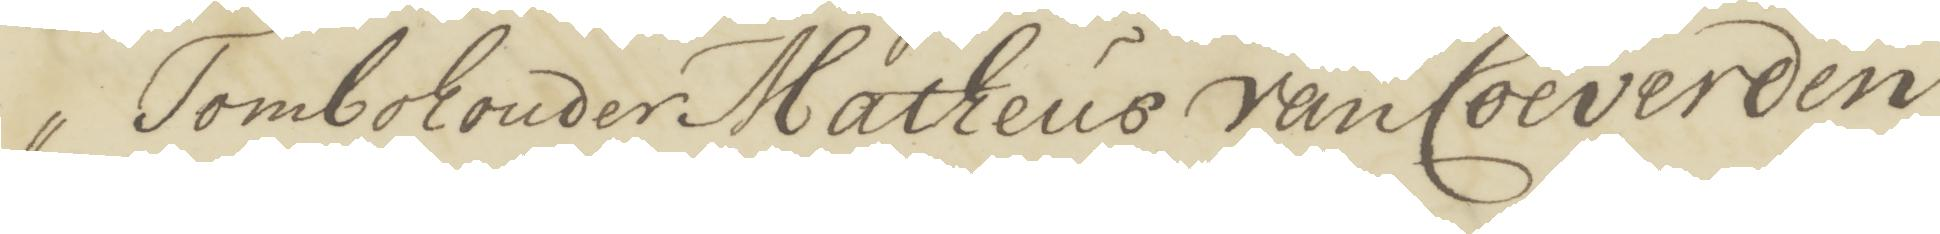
„ Tombohouder Matheus van Coeverden
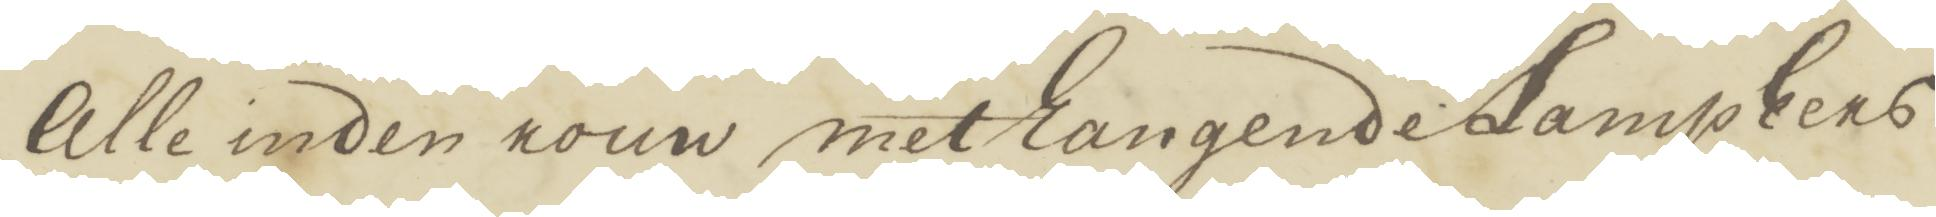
Alle inden rouw met hangende Lamphers
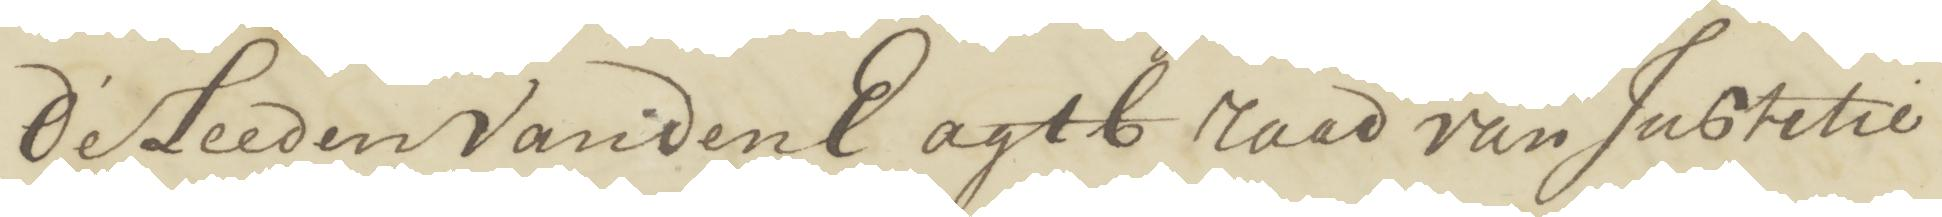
de Leeden van den E agtb raad van Justitie
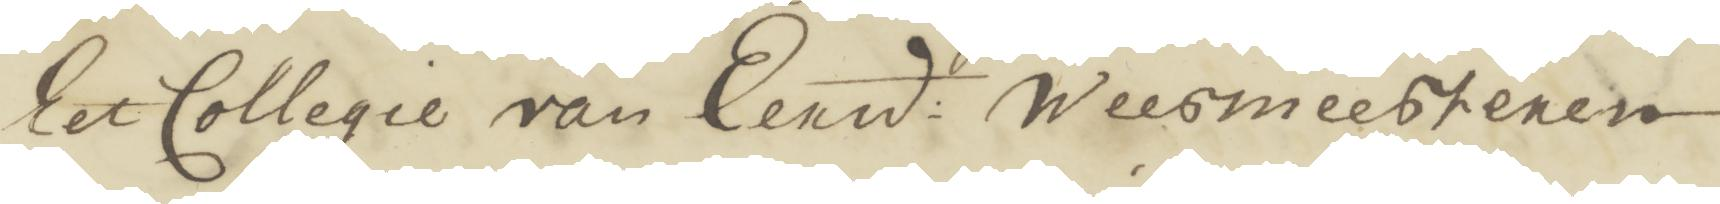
het Collegie van Eern: weesmeesteren
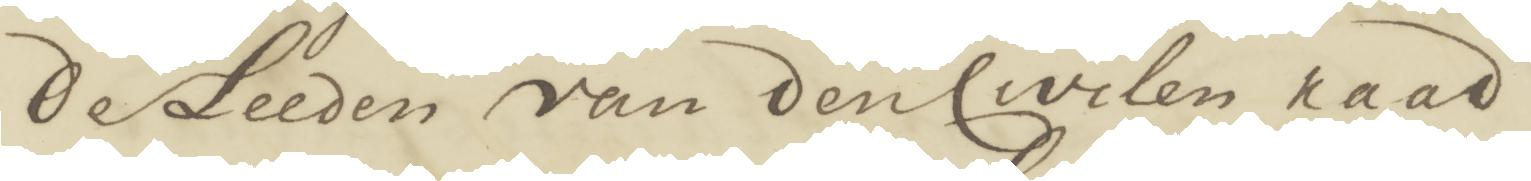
de Leeden van den Civilen raad
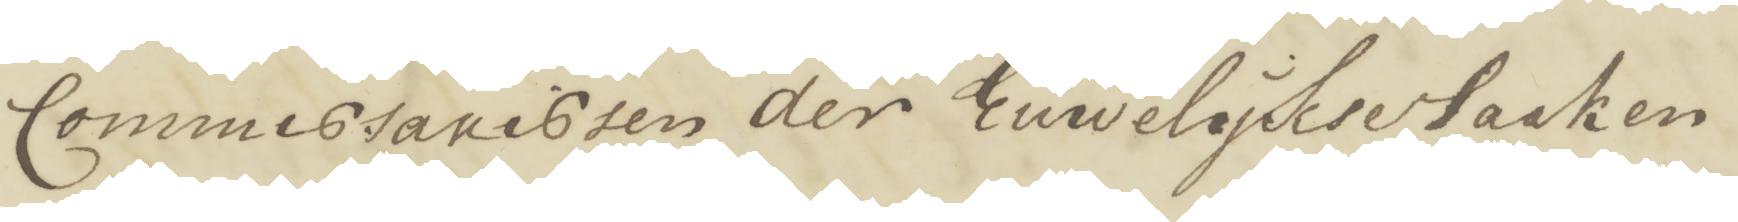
Commissarissen der huwelijkse saaken
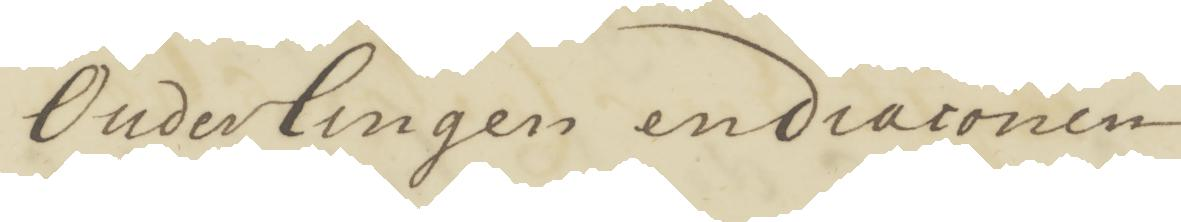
Ouderlingen en diaconen
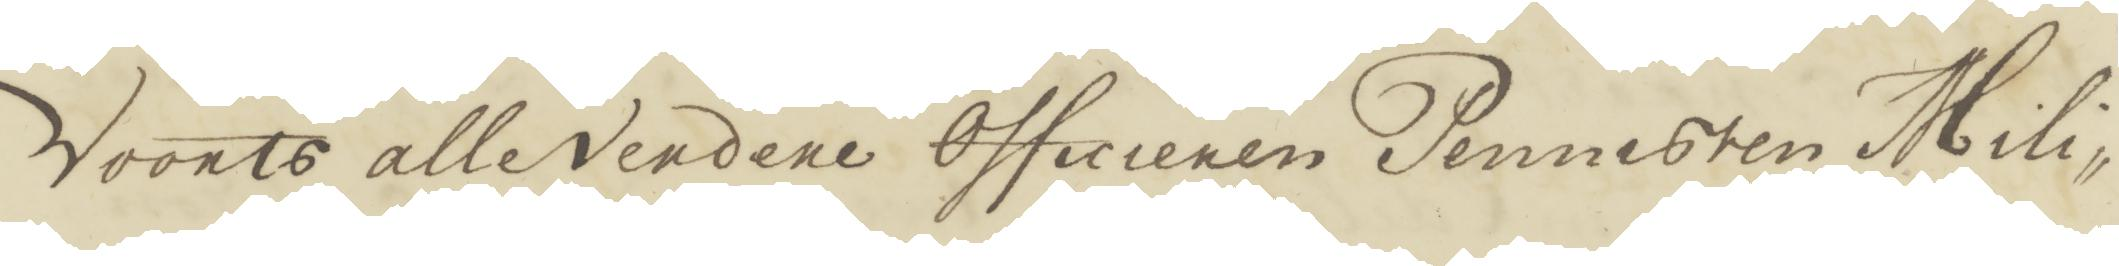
Voorts alle verdere Officieren Pennisten Mili„
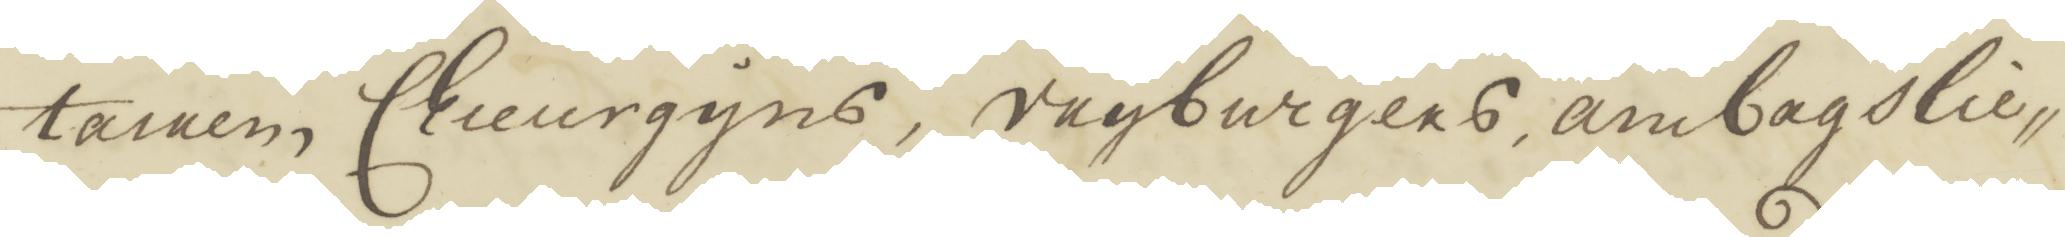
tairen, Chirurgijns, vrijburgers, ambagslie„
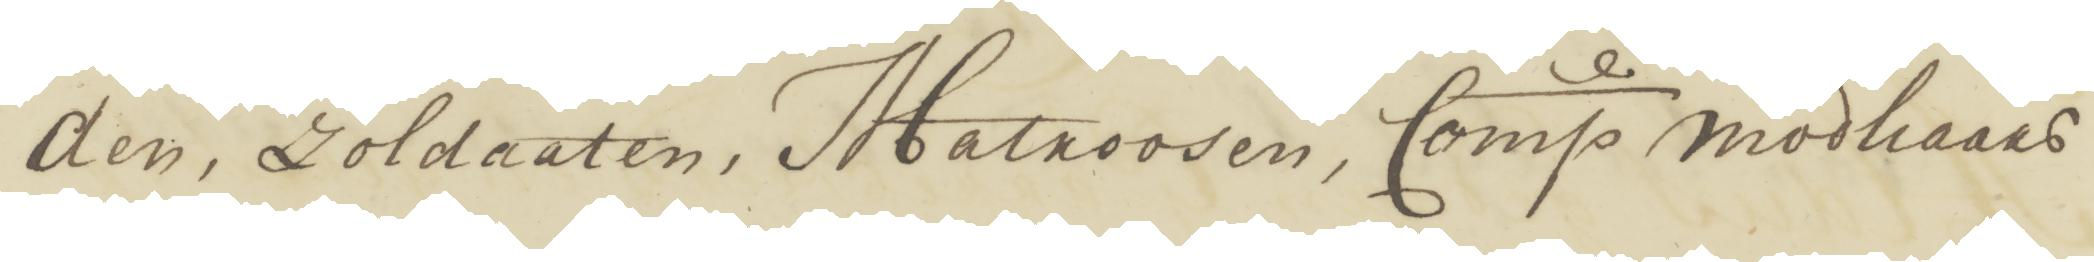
den, zoldaaten, Matroosen, Compe modhaars
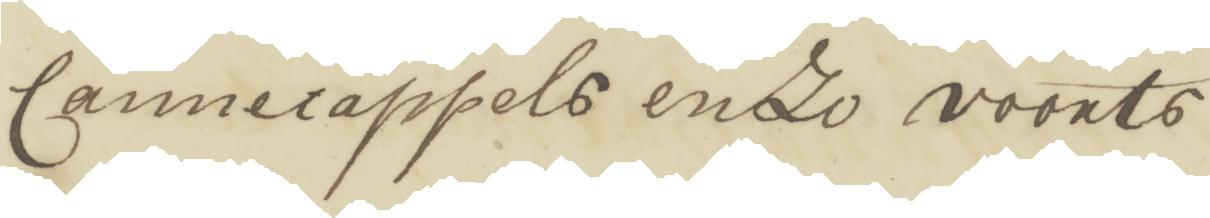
Cannecappels enzo voorts
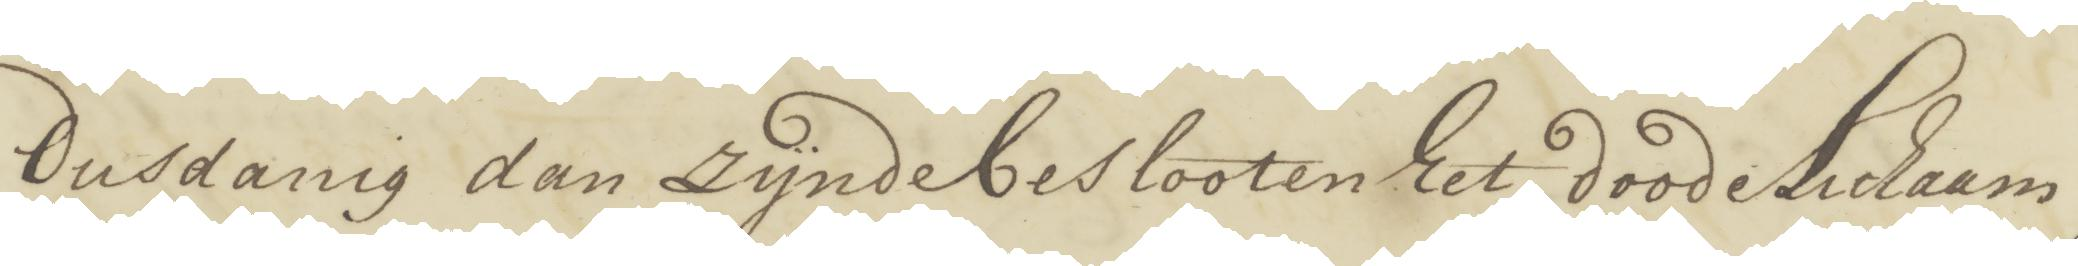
dusdanig dan zijnde beslooten het doode Lichaam
